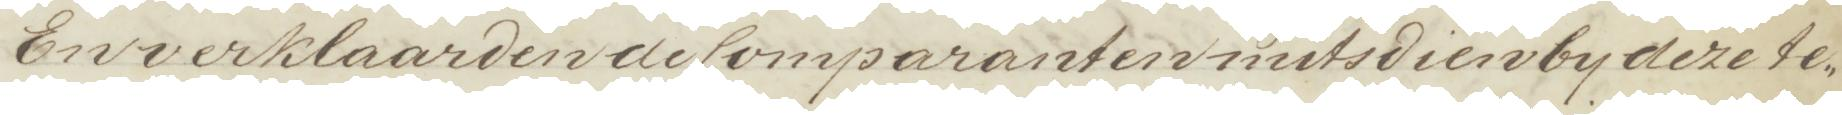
En verklaarden de Comparanten mitsdien by deze te„
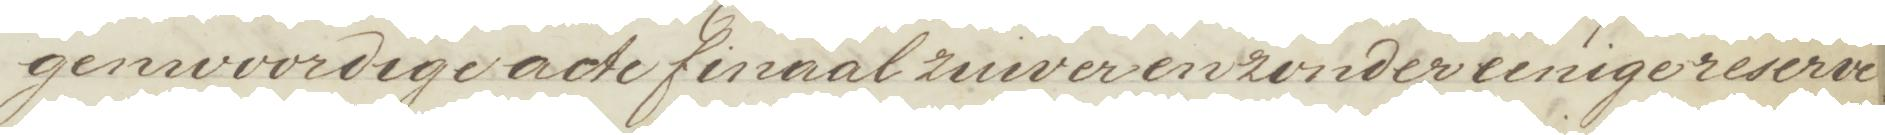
genwoordige acte finaal zuiver en zonder eenige reserve
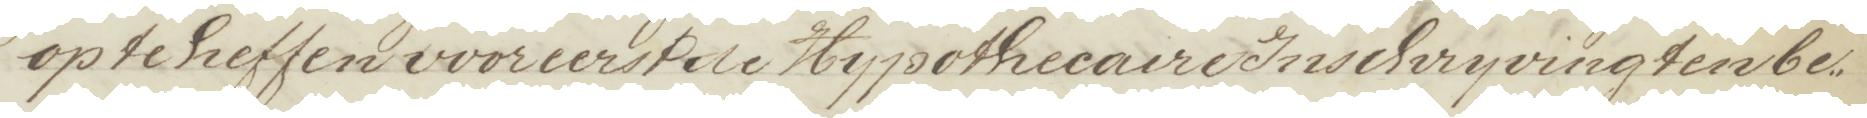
op te heffen voor eerst de Hypothecaire Inschryving ten be„
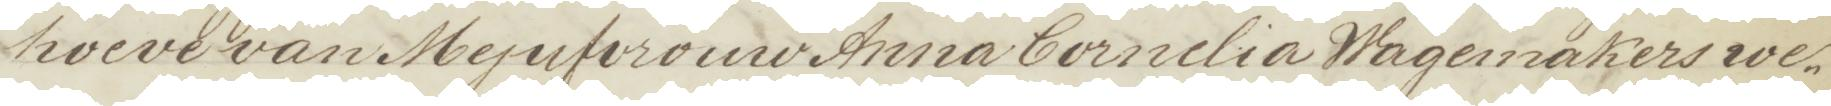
hoeve van Mejufvrouw Anna Cornelia Wagemakers we„
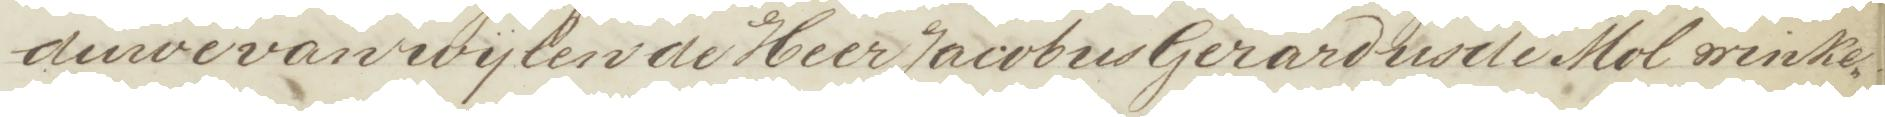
duwe van wijlen de Heer Jacobus Gerardus de Mol winke„
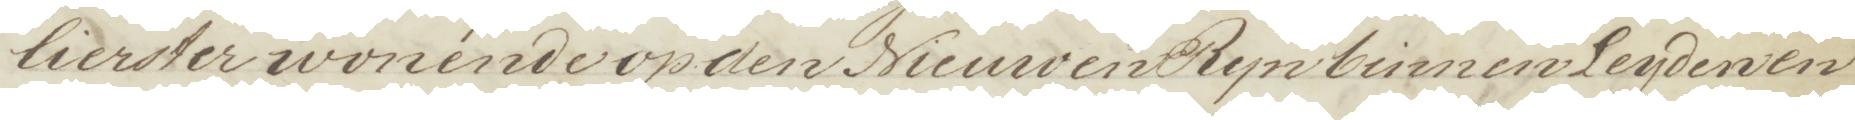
lierster wonende op den Nieuwen Ryn binnen Leyden en
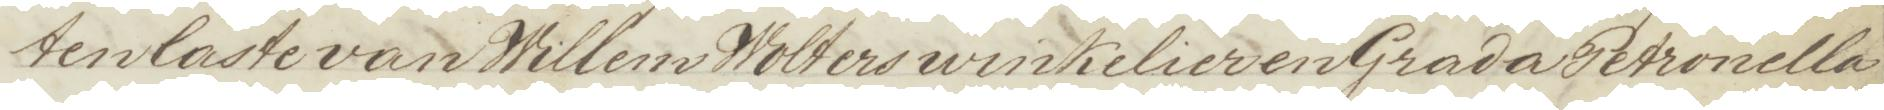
ten laste van Willem Wolters winkelier en Grada Petronella
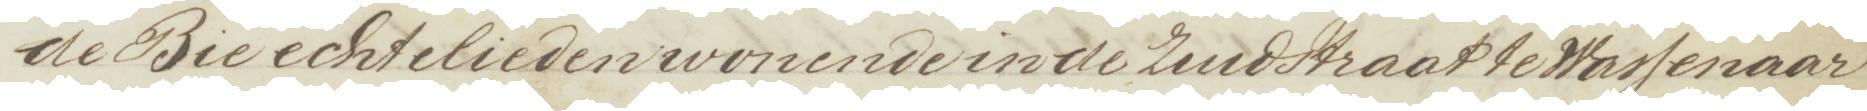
de Bie echtelieden wonende in de Zuidstraat te Wassenaar
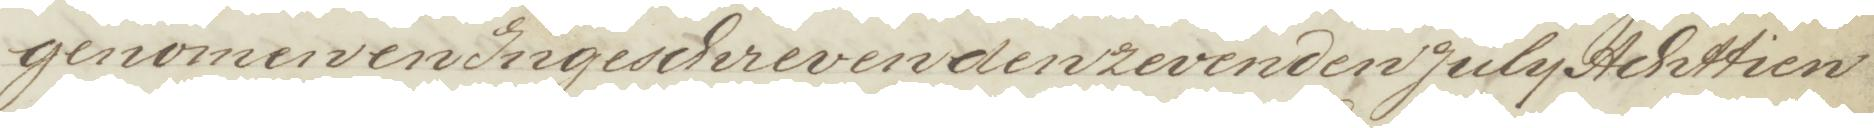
genomen en Ingeschreven den zevenden July Achttien
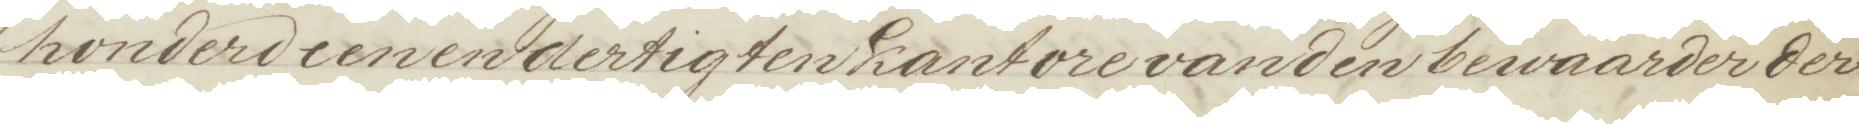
honderd een en dertig ten kantore van den bewaarder der
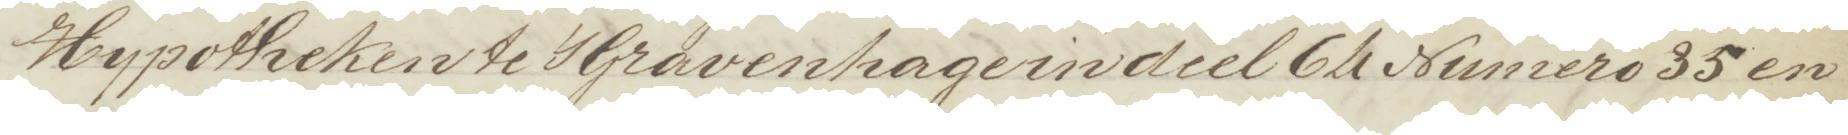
Hypotheken te 's Gravenhage in deel 64 Numero 35 en
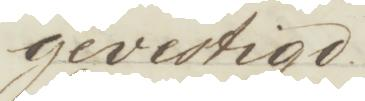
gevestigd.
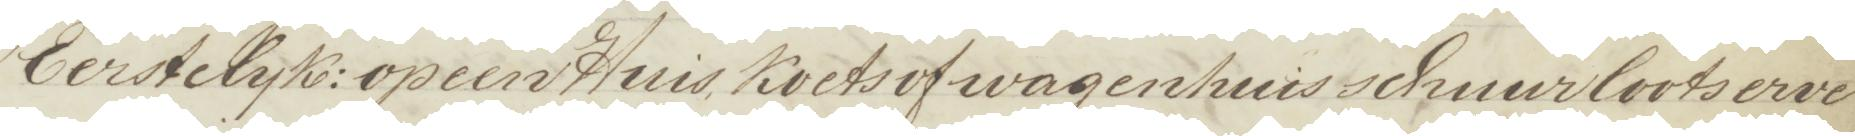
Eerstelyk: op een Huis, Koets of wagenhuis schuur loots erve
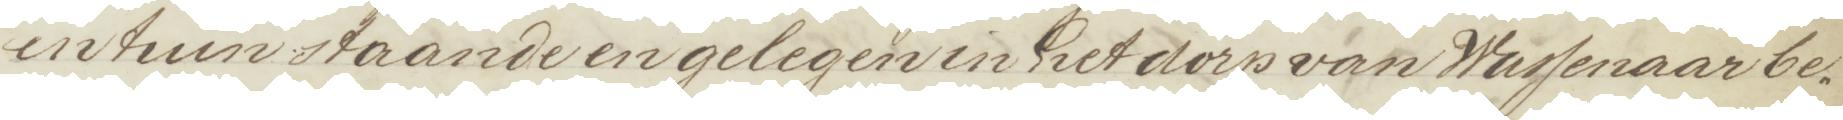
en tuin staande en gelegen in het dorp van Wassenaar be„
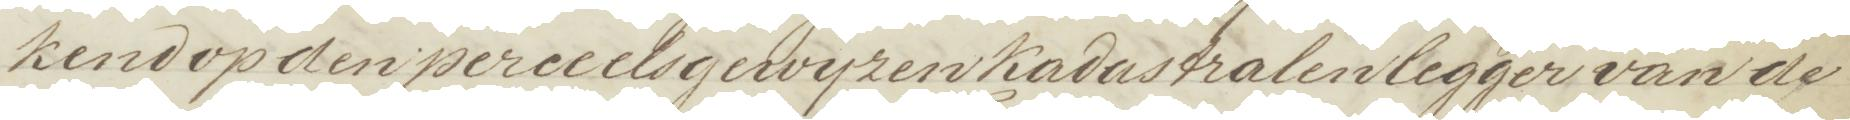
kend op den perceelsgewyzen kadastralen legger van de
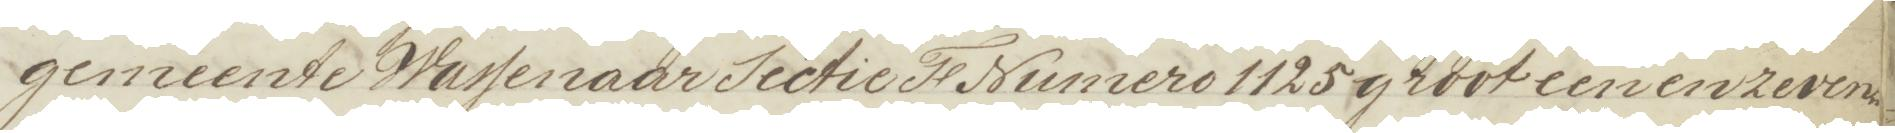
gemeente Wassenaar Sectie F Numero 1125 groot een en zeven„
